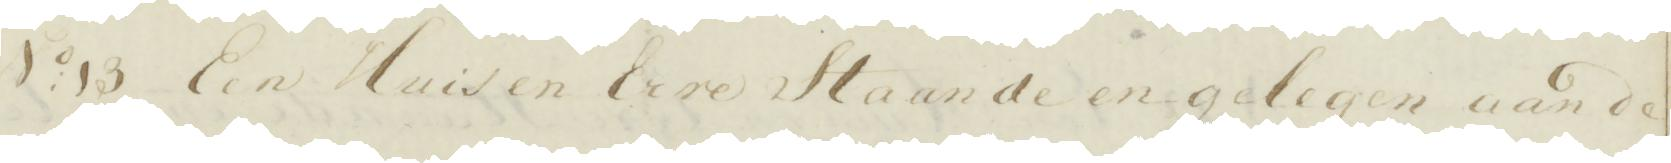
N:o 13 Een Huisen Erve staande en gelegen aan de
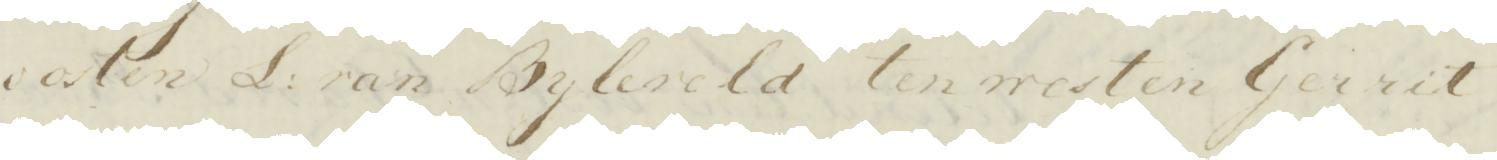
Oosten L: van Byleveld ten westen Gerrit
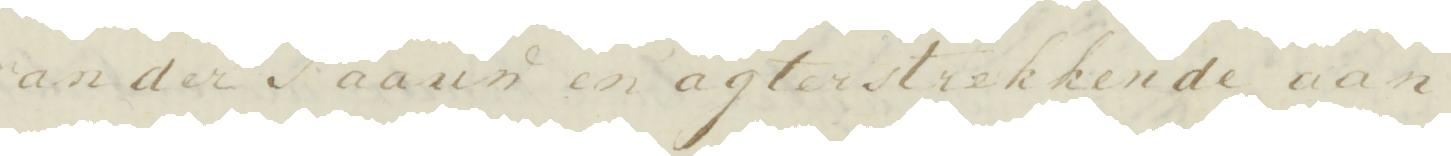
van der Paauw en agterstrekkende aan
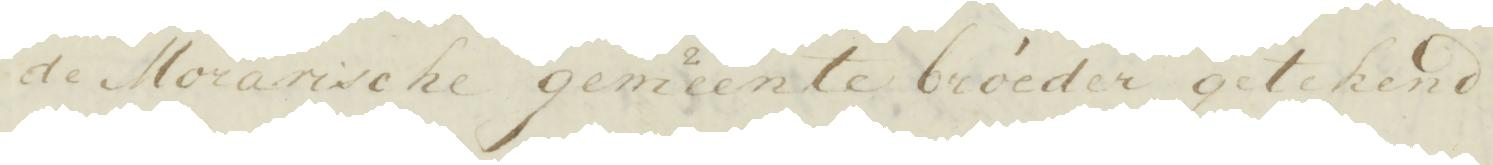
de Moravische broeder gemeente getekend
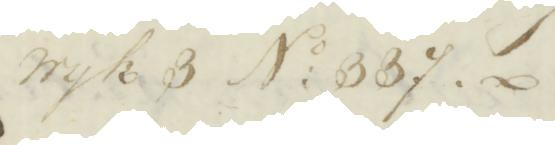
wijk 3 N:o 337. —
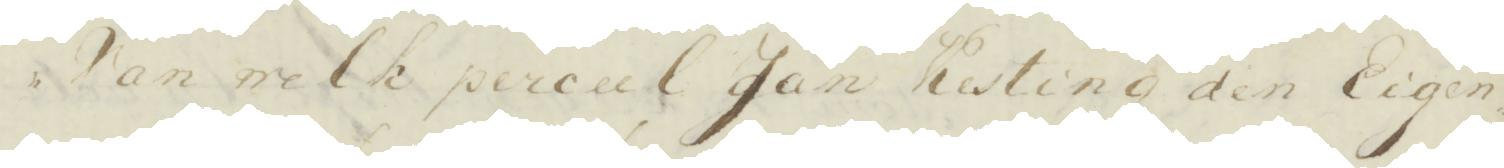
„Van welk perceel Jan Kesting den Eigen„
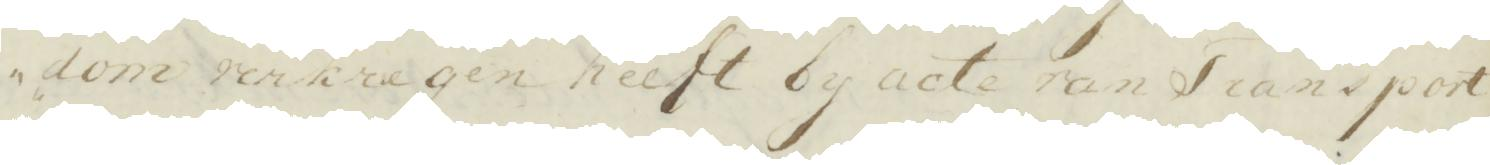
„dom verkregen heeft by acte van Transport
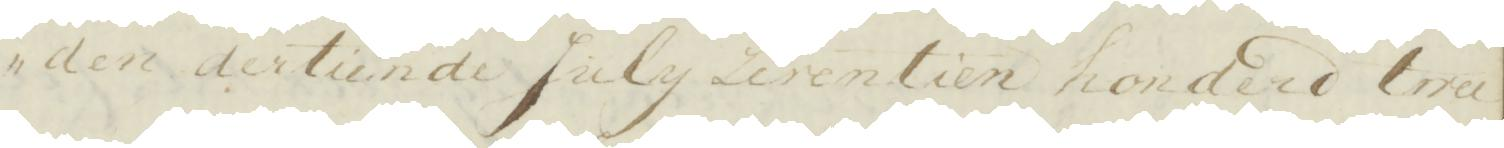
„den dertiende July zeventien honderd twee
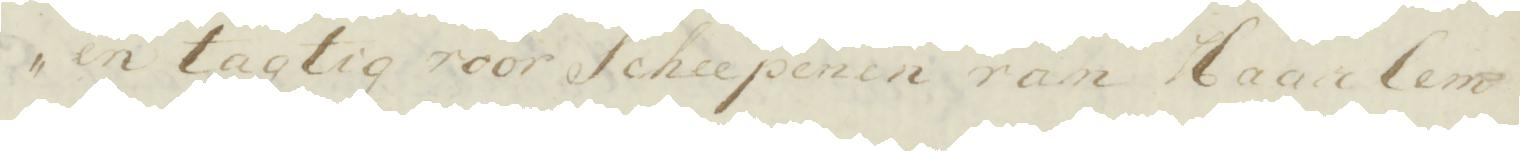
„en tagtig voor scheepenen van Haarlem
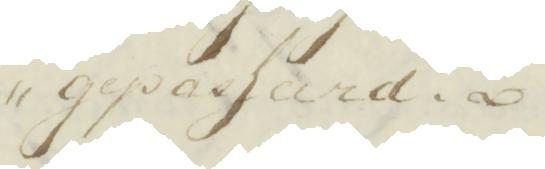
„gepasseerd. —
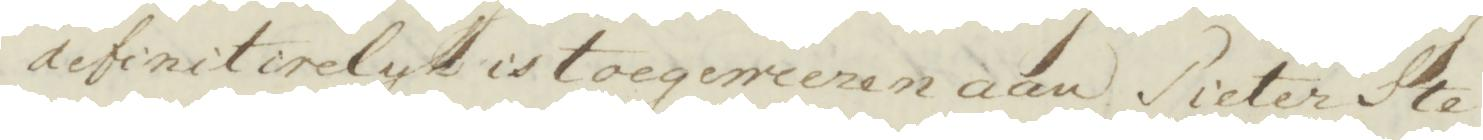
definitivelyk is toegeweezen aan Pieter ste
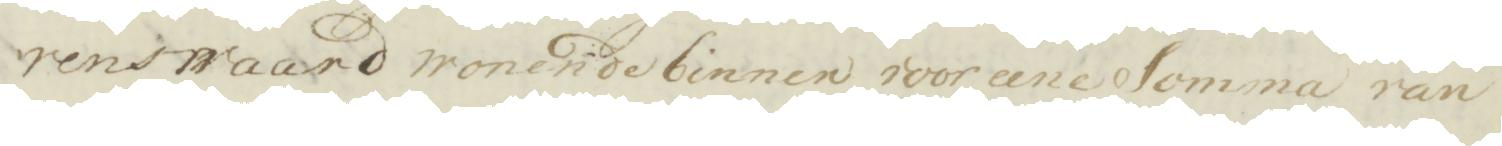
venswaard wonende binnen voor eene somma van
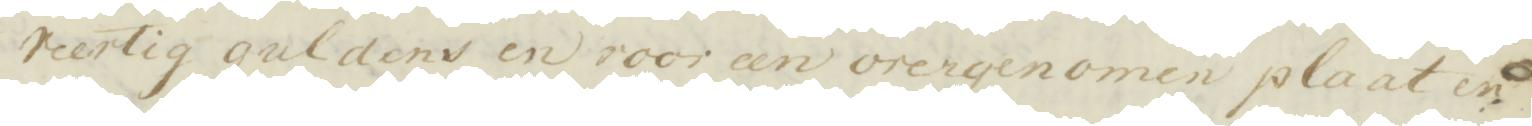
veertig guldens en voor een overgenomen plaat en
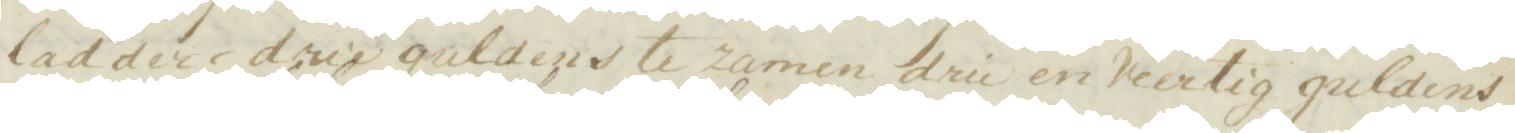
laddere drie guldens te zamen drie en veertig guldens
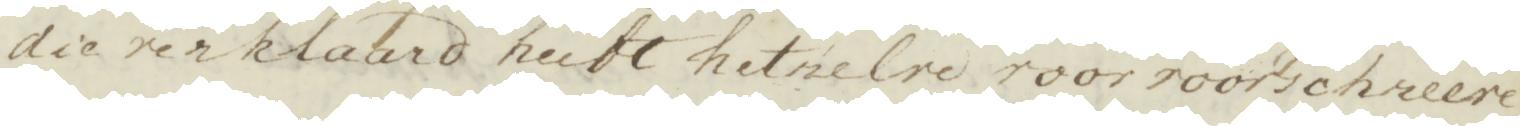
die verklaard heeft hetzelve voor voorschreeve
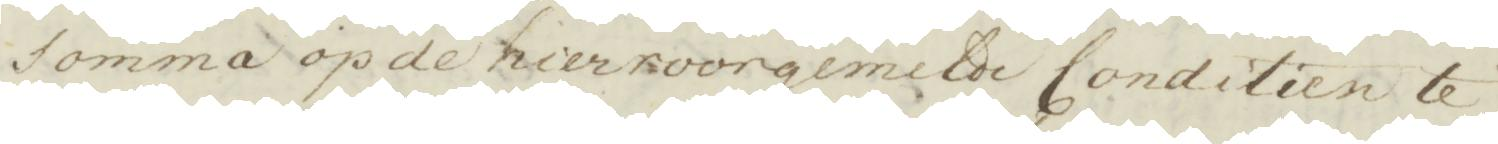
somma op de hiervoorgemelde Conditien te
